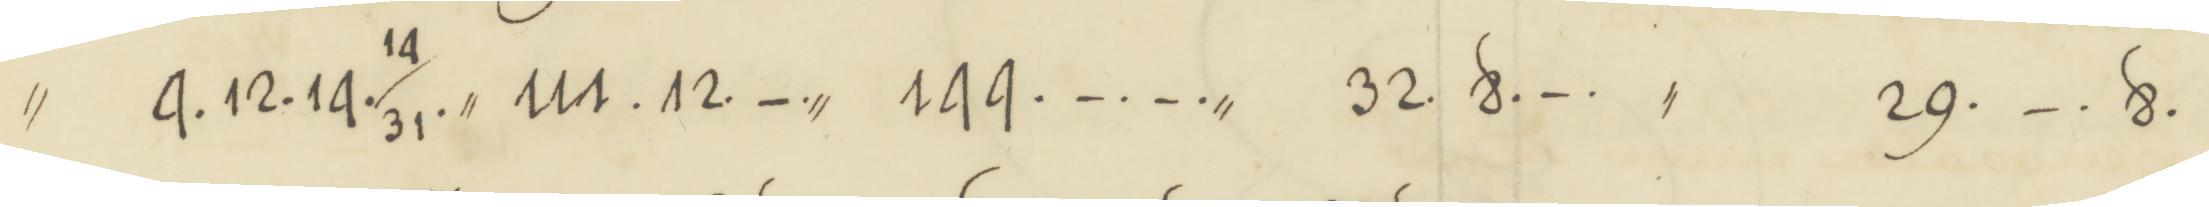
„ 4. 12. 14.14/31. „ 111. 12. – . „ 144 . – . – . „ 32. 8. – . „ 29. – . 8.
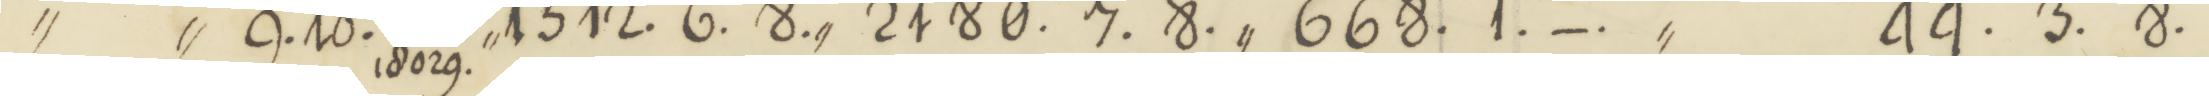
„ „ 9. 10. 14414/18029. „ 1512. 6. 8. „ 2189. 7. 8. „ 668. 1. – . „ 44. 3. 8.
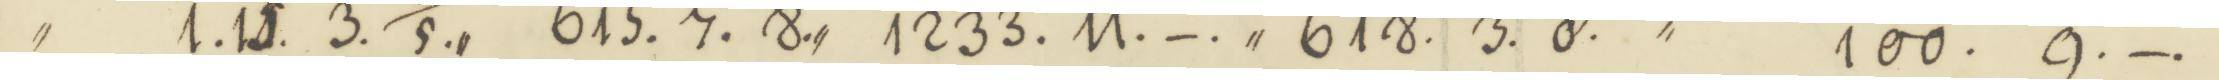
„ 1.15. 3. 2/5.„ 615. 7. 8.„ 1233. 11. – . „ 618. 3. 8. „ 100. 9. –.
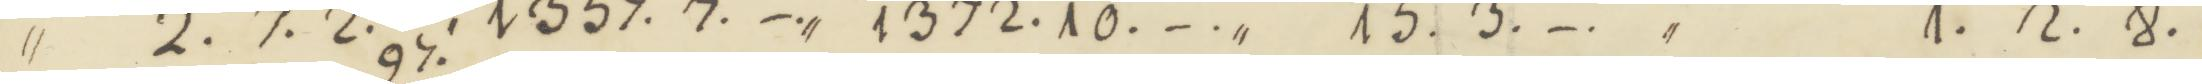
„ 2. 7. 2.62/97., 1357. 7. – .„ 1372. 10. – . „ 15. 3. – . „ 1. 2. 8.
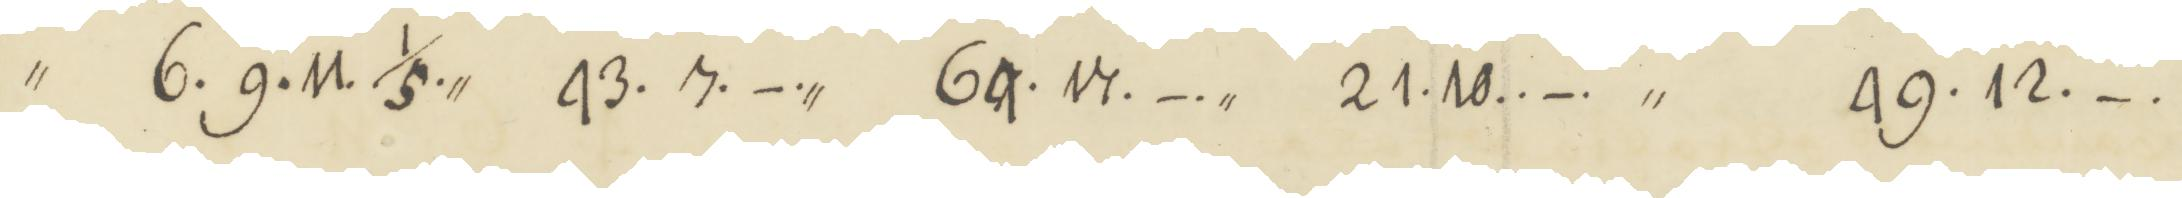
„ 6. 9. 11. 1/5. „ 43. 7. – .„ 64. 17. –. „ 21. 10. . – . „ 49. 12. – .
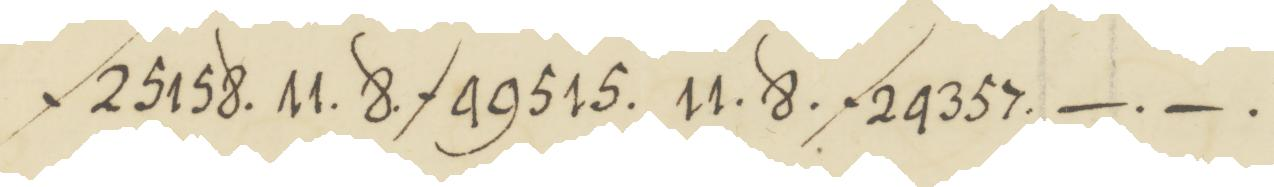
ƒ 25158. 11. 8. ƒ49515. 11. 8. ƒ24357. — . — .
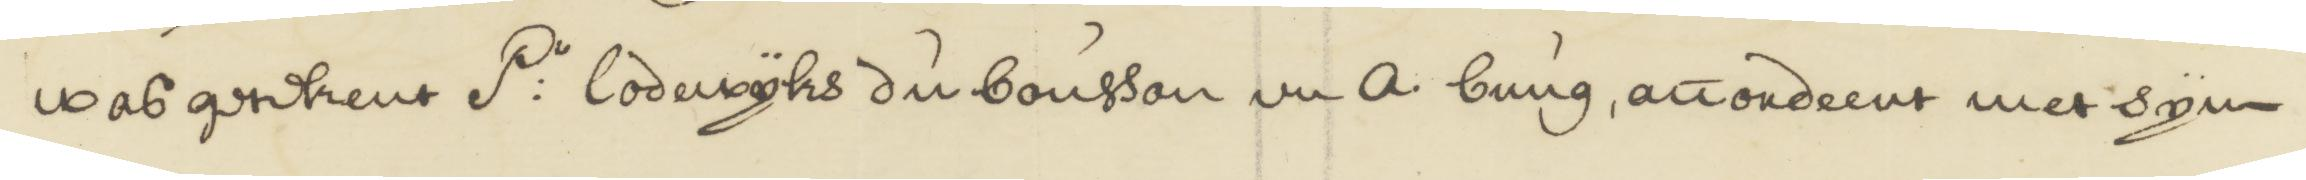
was getekent P:r lodewijks du bousson en a. brug, accordeert met sijn
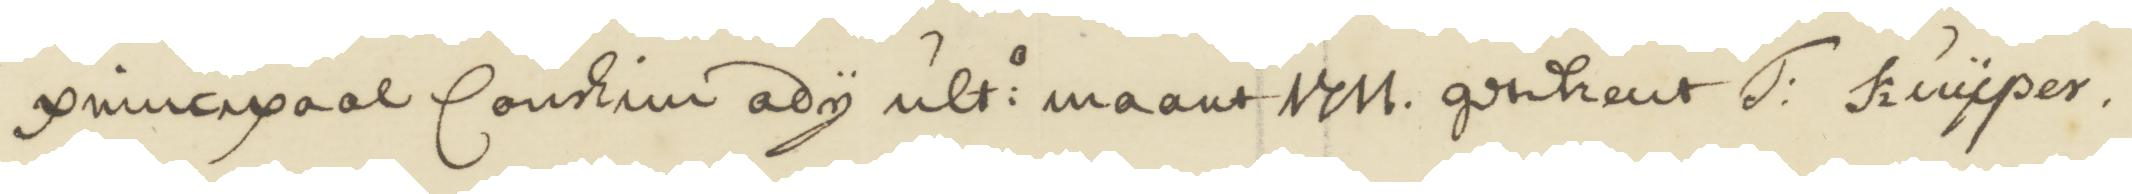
principaal Couchim adij ult:o maart 1711. getekent T: kuijper.
